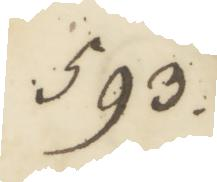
593.
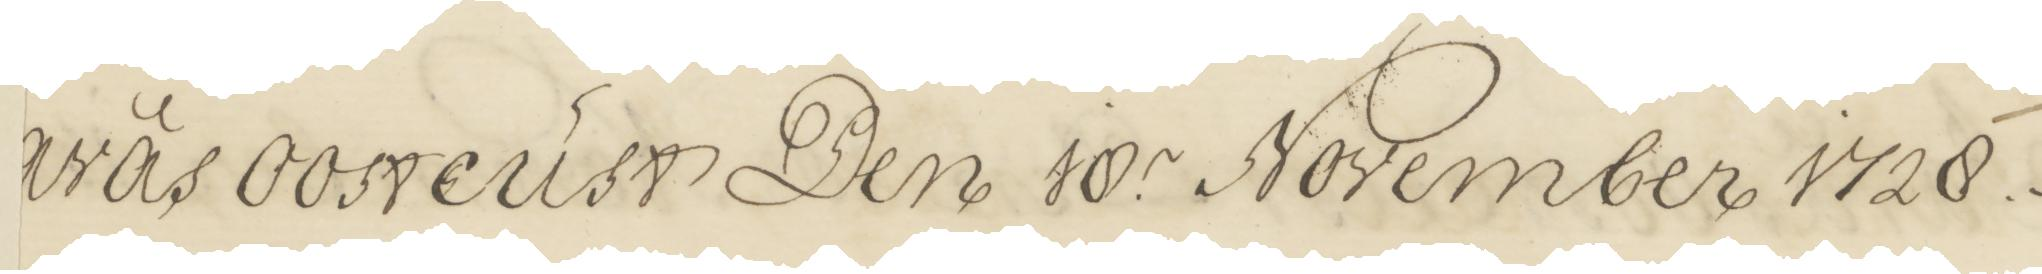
avâs oost cust Den 18:' November 1728.
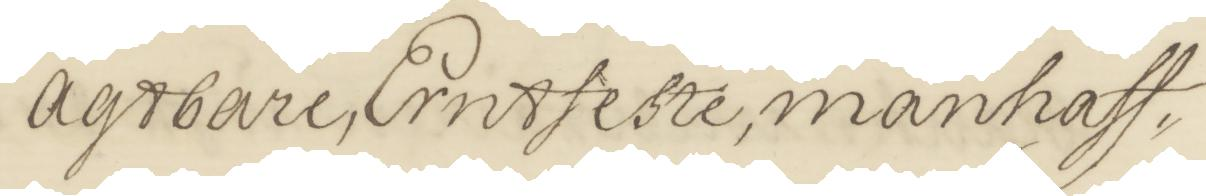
agtbare, Erntfeste, manhaff„
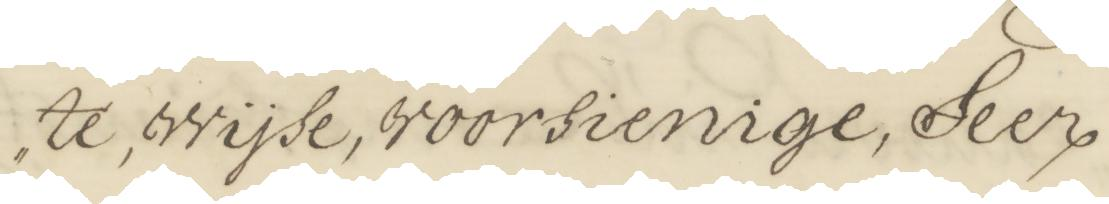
„te, wijse, voorsienige, Seer
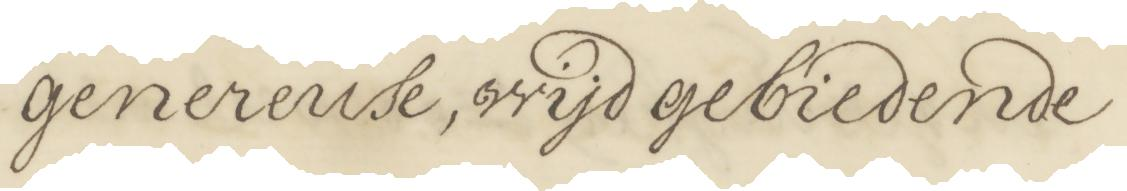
genereuse, wijd gebiedende
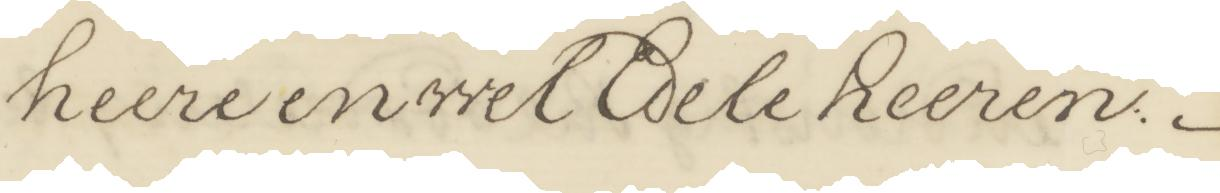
heere en wel Edele heeren.
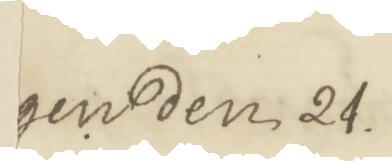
gen den 24.
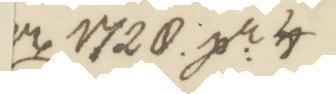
r 1728. p:r 't
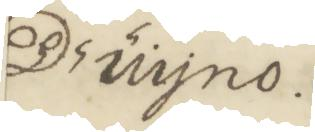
De uijno.
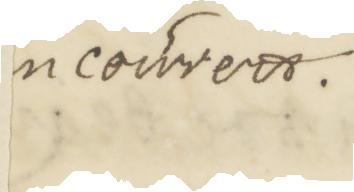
n couvert.
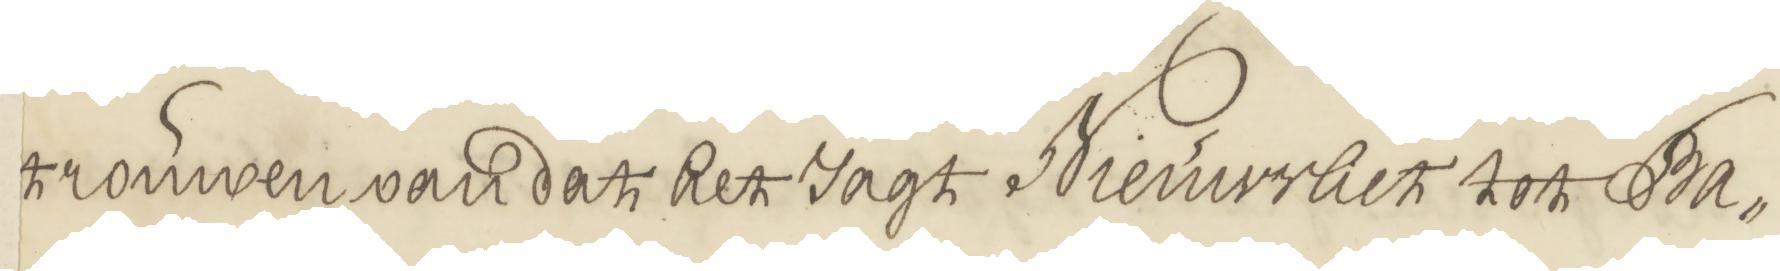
trouwen van dat het Jagt Nieuwvliet tot Ba„
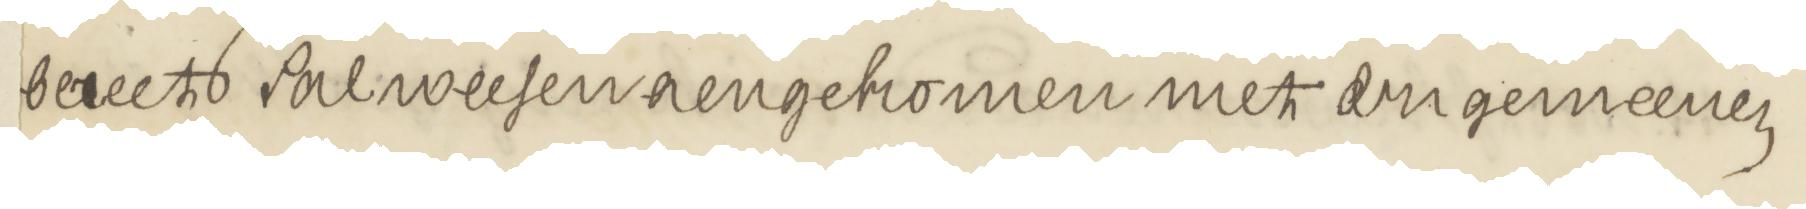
bereets sal weesen aengekomen met den gemeenen
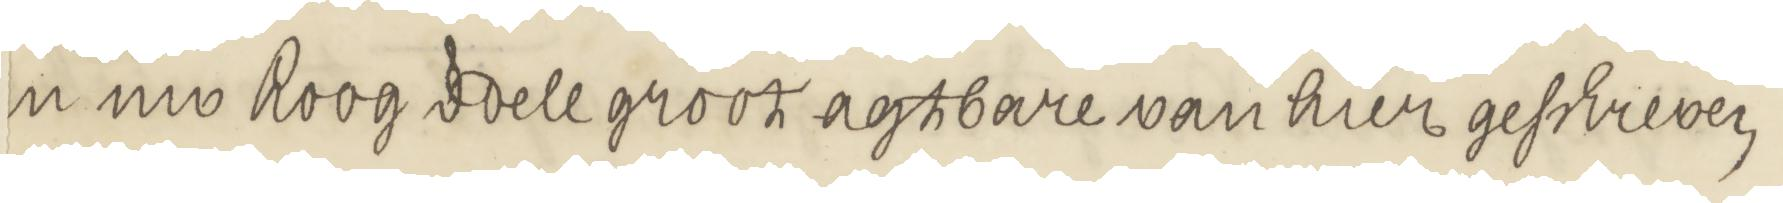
n uw hoog Edele groot agtbare van hier geschreven
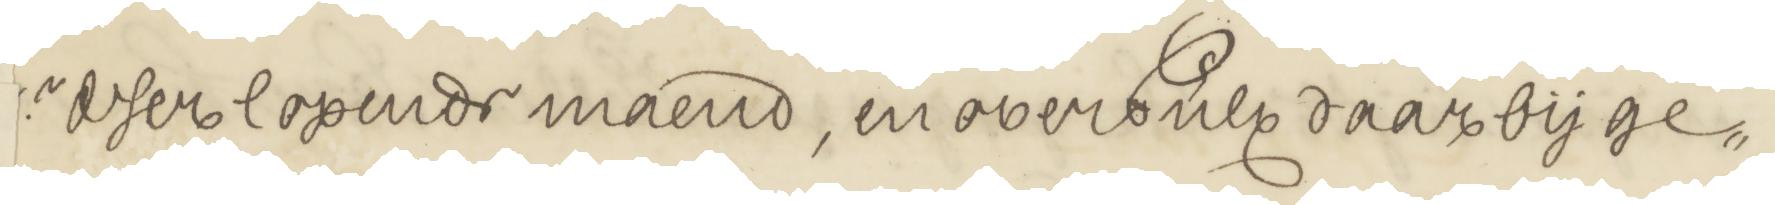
:r en deser lopende maend, en oversulx daar bij ge„
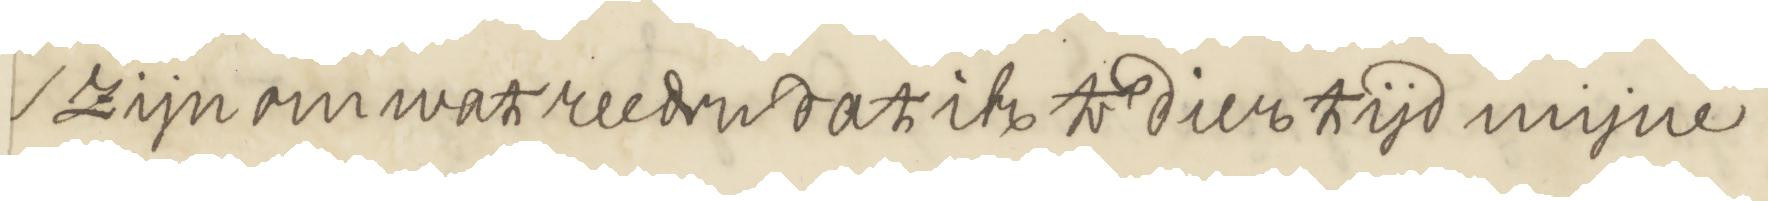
zijn om wat reeden dat ik te dier tijd mijne
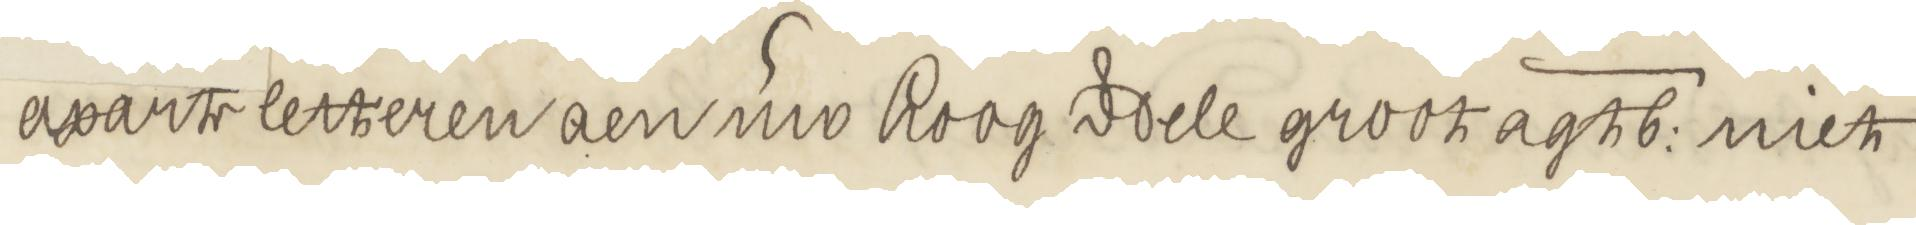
aparte letteren aen uw hoog Edele groot agtb: niet
